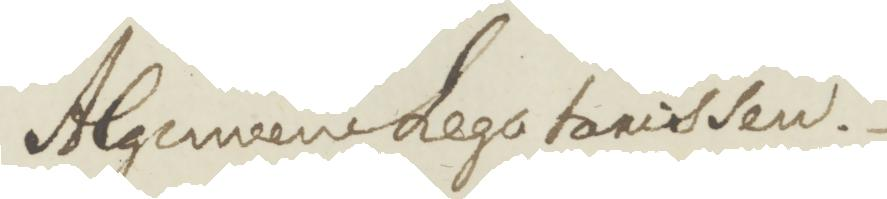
Algemeene Legatarissen.
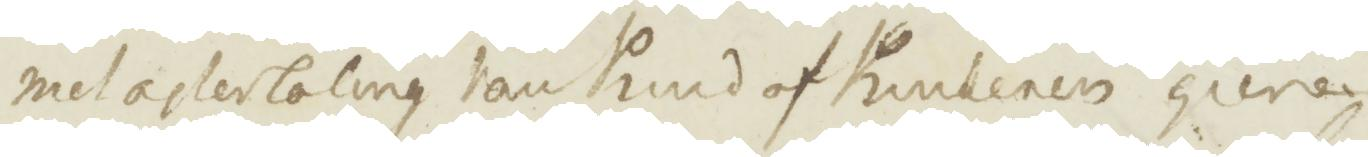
met agterlating van Kind of Kinderen geeven
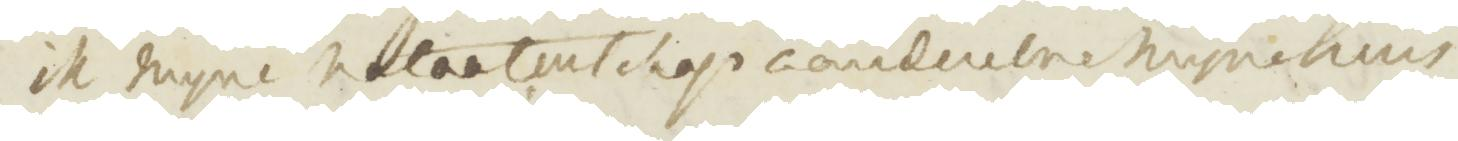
ik myne nalaatenschap aan deselve mijne huis
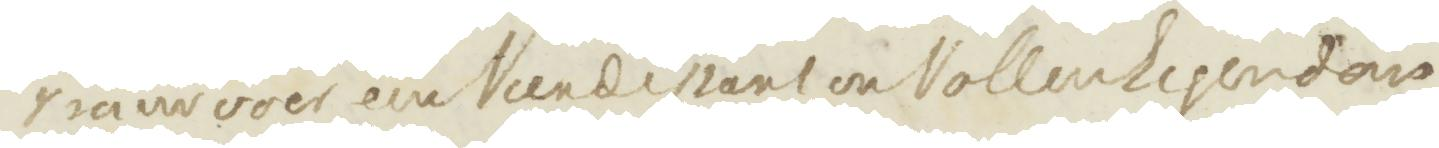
vrouw voor een Vierdepart en vollen Eigendom
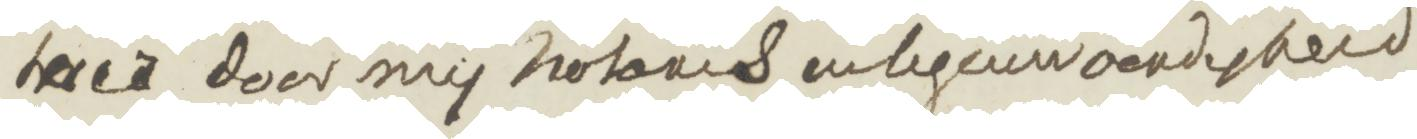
teur door mij notaris integenwoordigheid
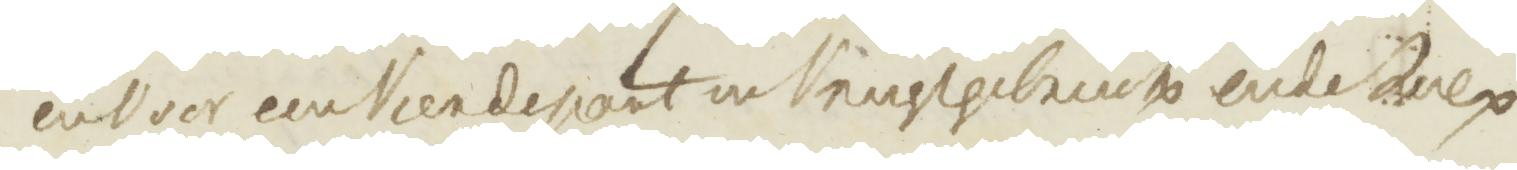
en Voor een Vierde part in Vrugtgebruik ende zulx
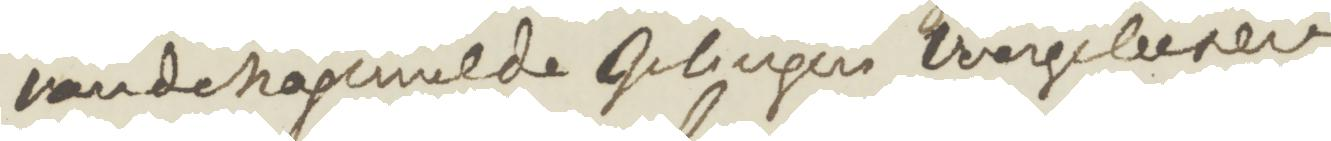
van de nagemelde getuigen voorgelesen
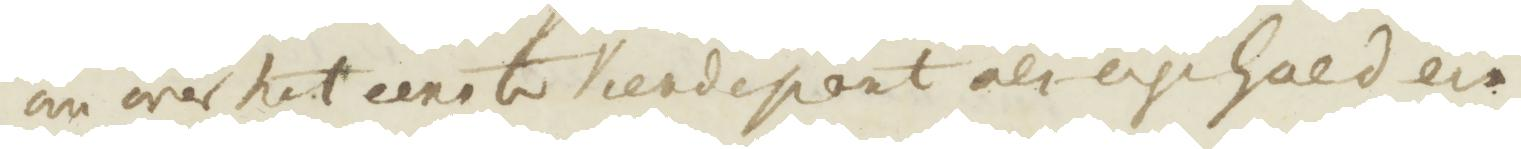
om over het eerste Vierde part als erfgoederen
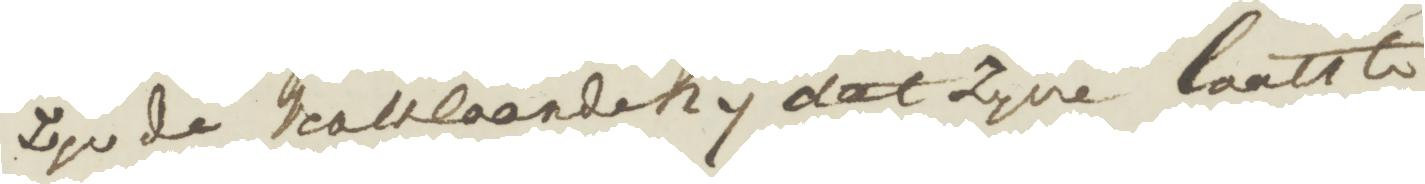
zynde verklaarde hy dat zyne laatste
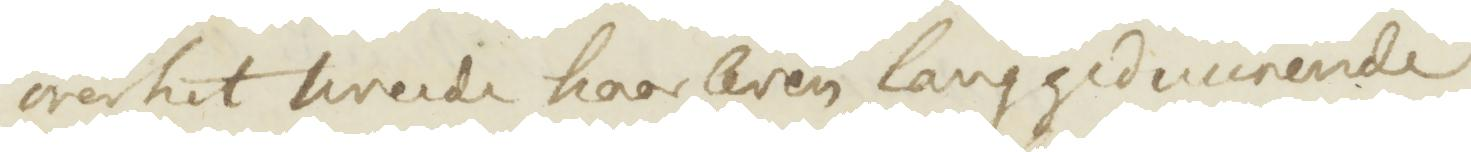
over het tweede haar leven lang geduurende
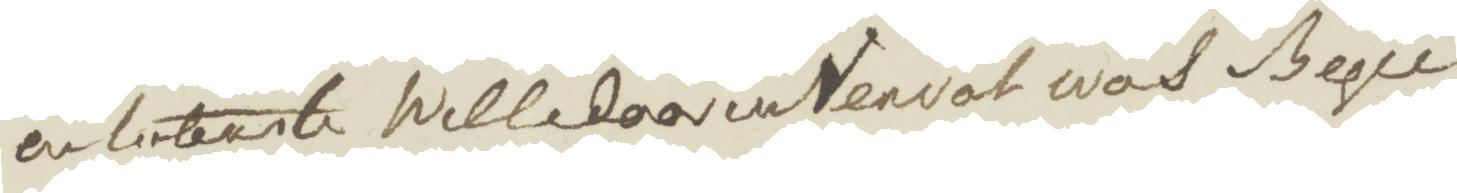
en uiterste wille daar in Vervat was Begee
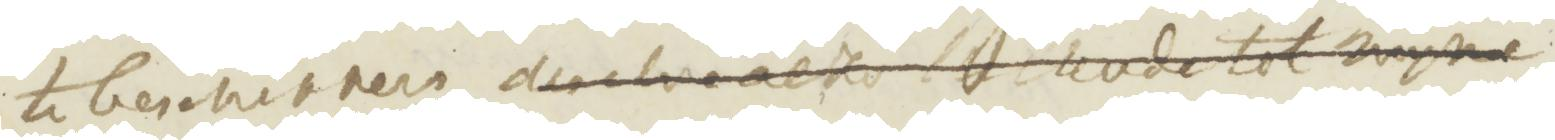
te beschikken deselve alzo kade tot mijne
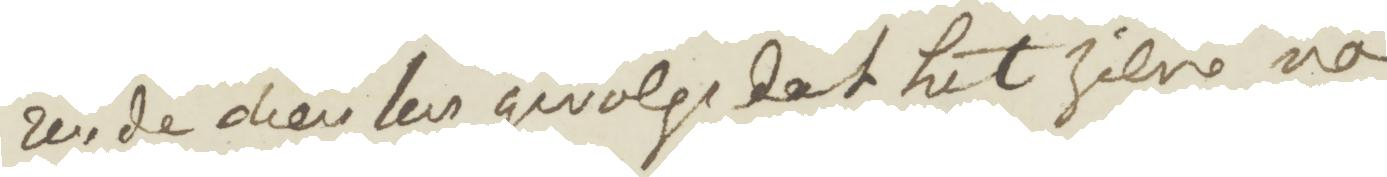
rende dien ten gevolge dat het zelve na
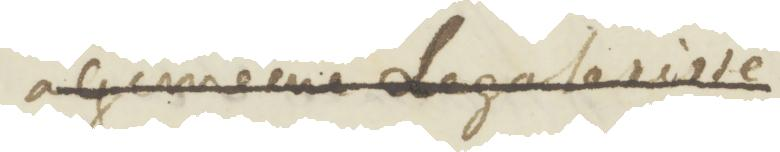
a Gemeene Legaterisse.
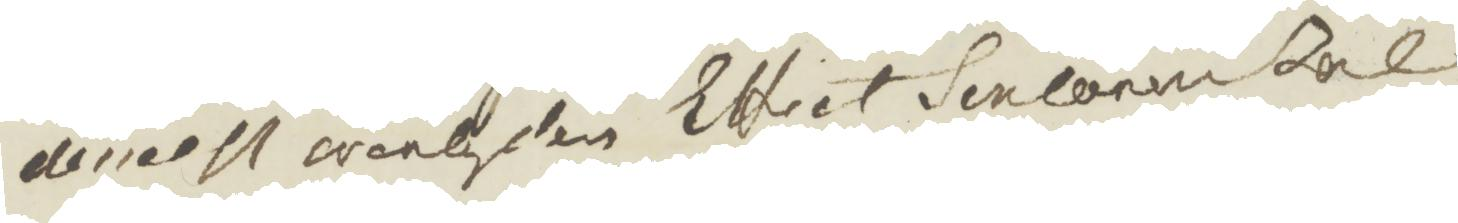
de eerst overlyden Effect sorteeren zal
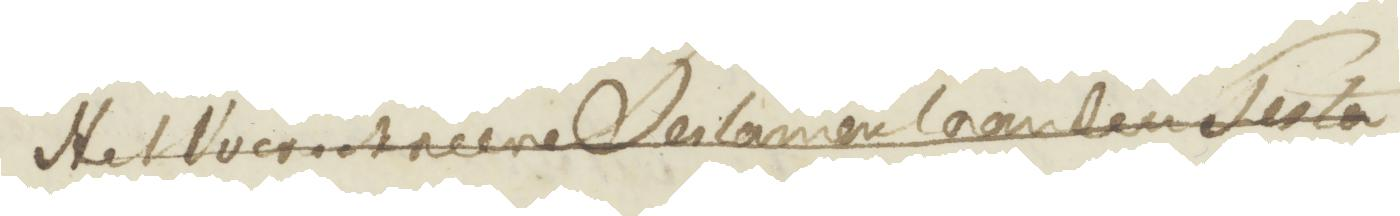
Het voorschreeve Testament aan den Testa
